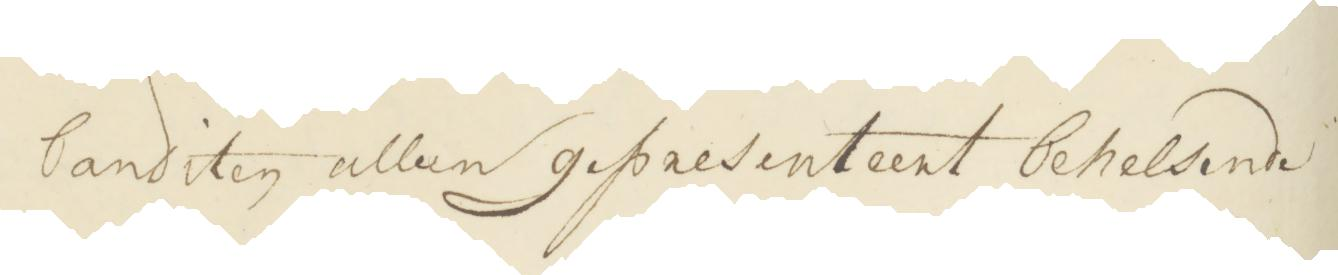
banditen alleen gepresenteert behelsende
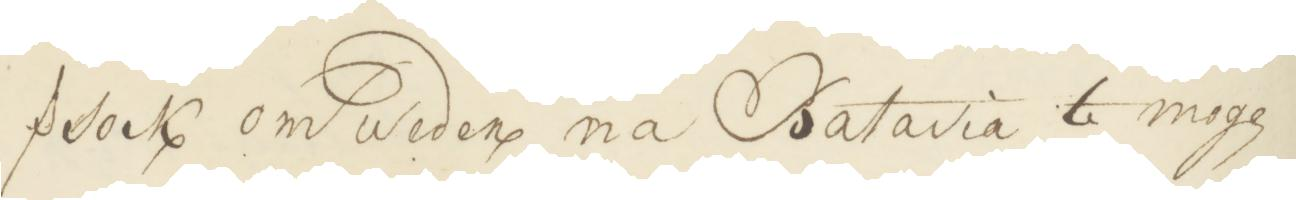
versoek om weder na Batavia te mogen
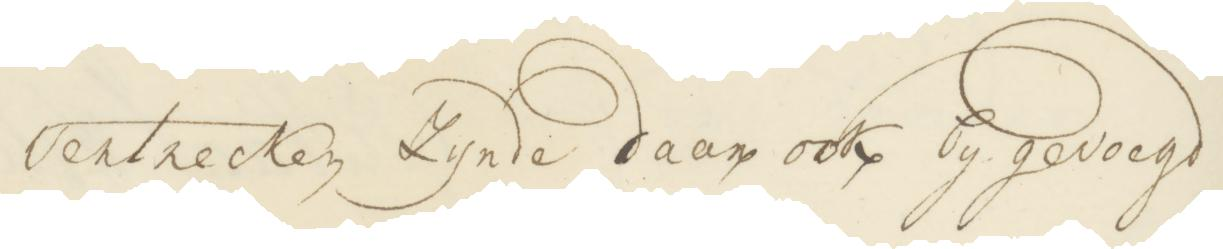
vertrecken zynde daar ook by gevoegd
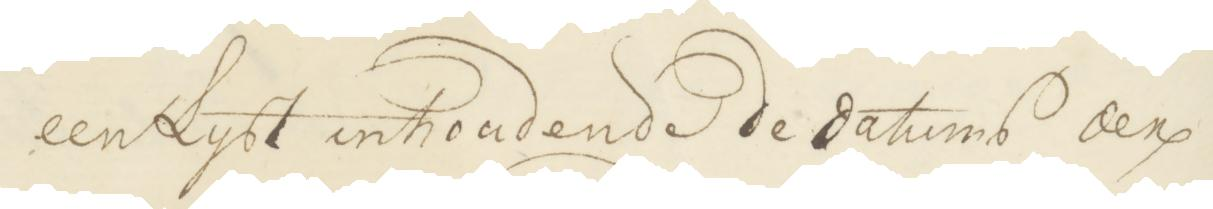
een Lyst inhoudende de datums der
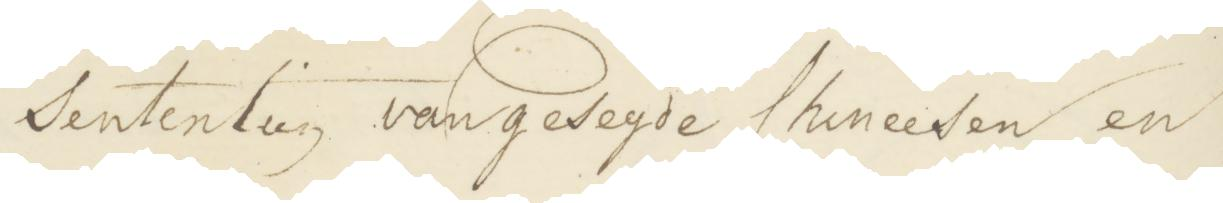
sententien van gesegde Chineesen en
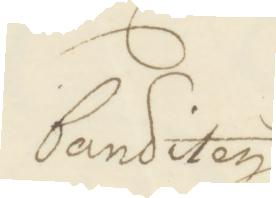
banditen
